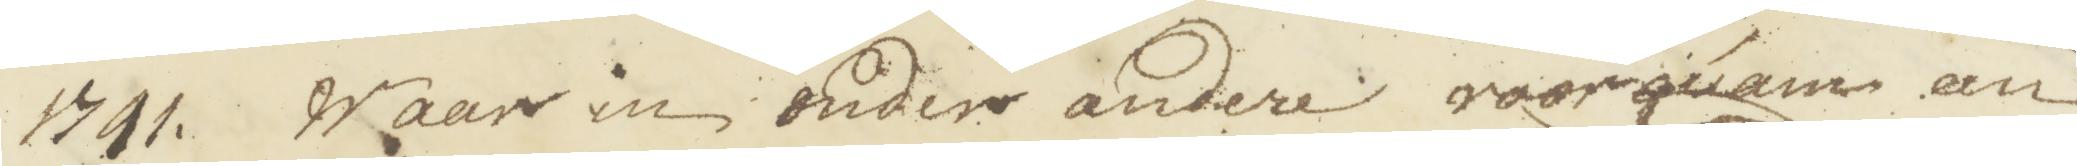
1741. waar in onder andere voorquam een
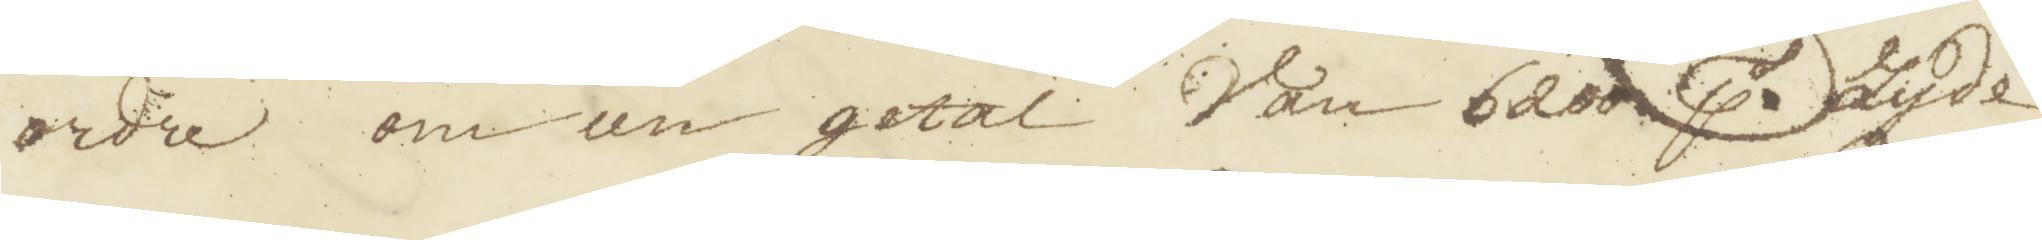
ordre om een getal van 6800 p=s zijde
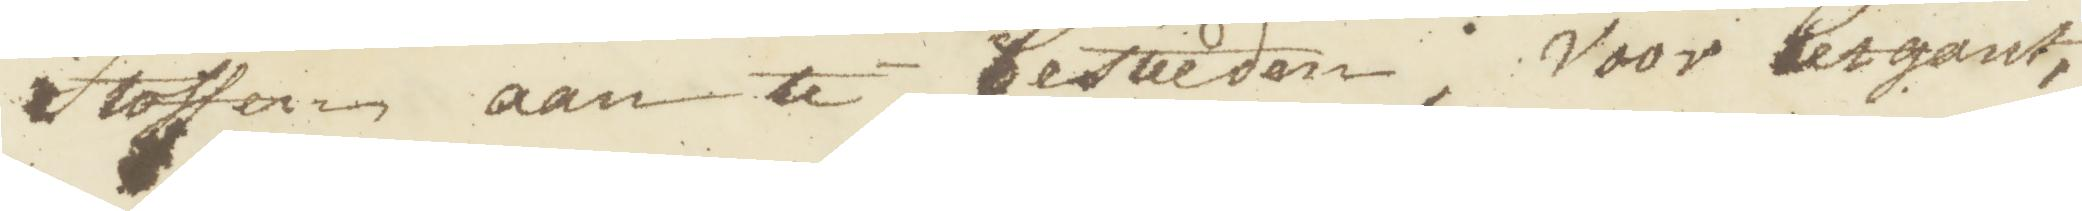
stoffen aan te besteeden; voor het gans,
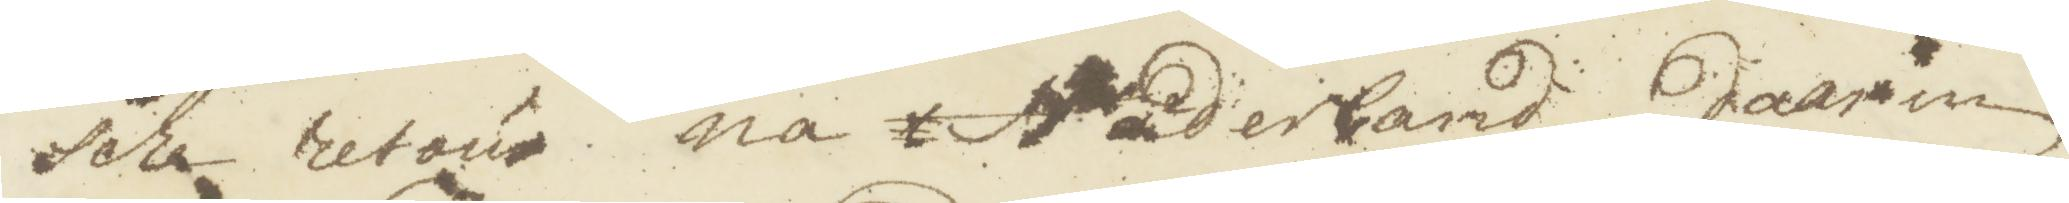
sche retour na 't Vaderland, daar in
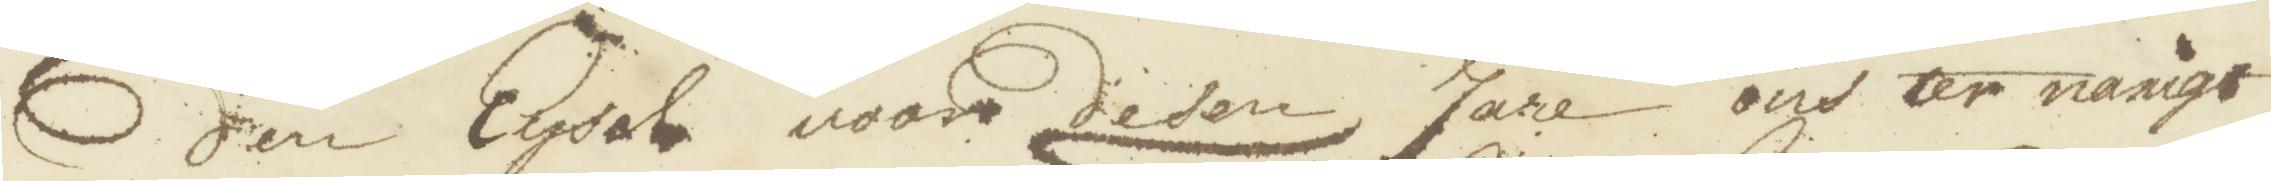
den Eijsch voor desen Jare ons ter narigt
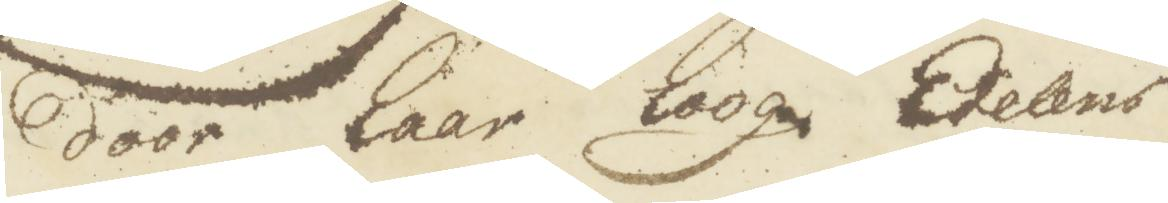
en observantie door haar hoog Edelens
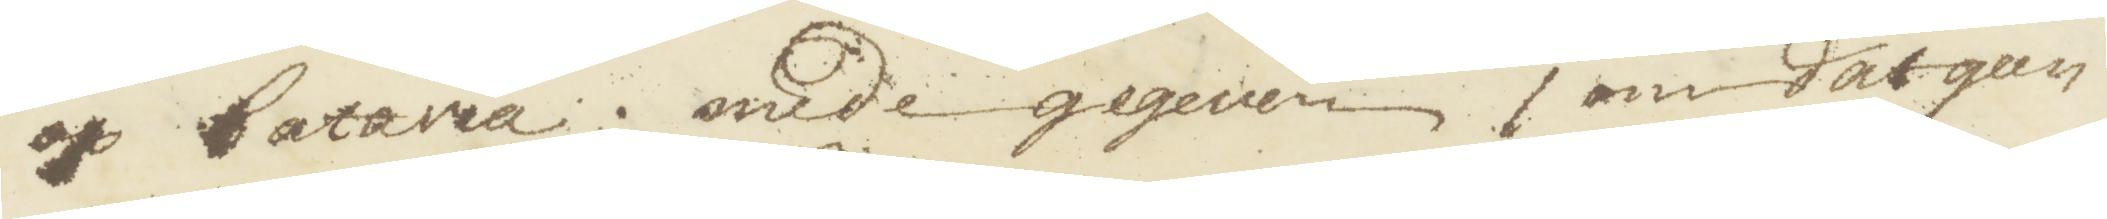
op batavia mede gegeven / om dat geen
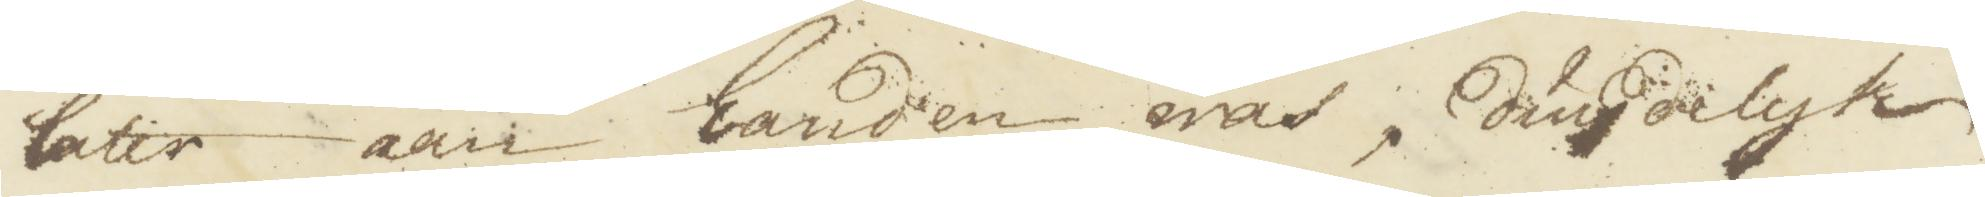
later aan handen was, duydelyk
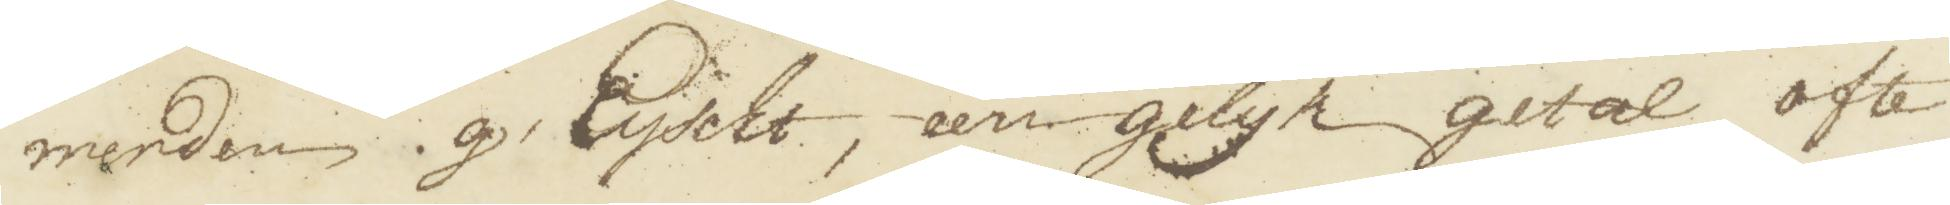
menden g' Eyscht, een gelyk getal ofte
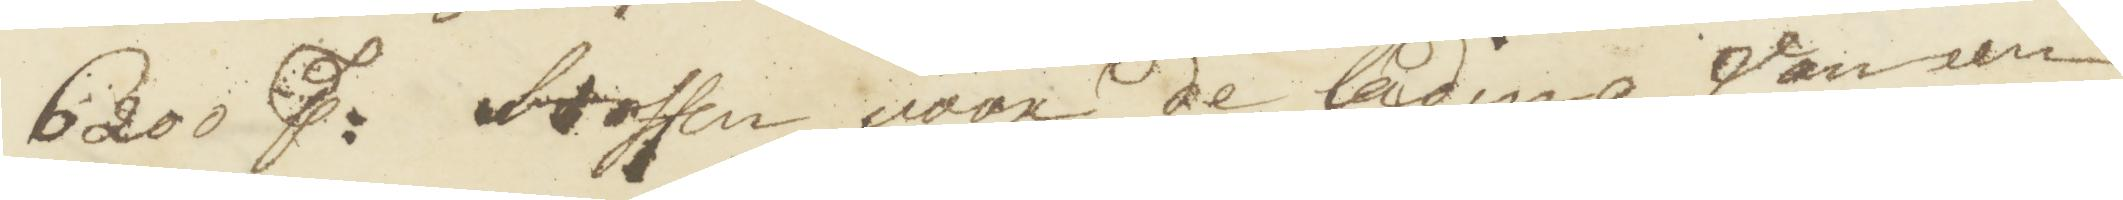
6200 p:s stoffen voor de lading van een
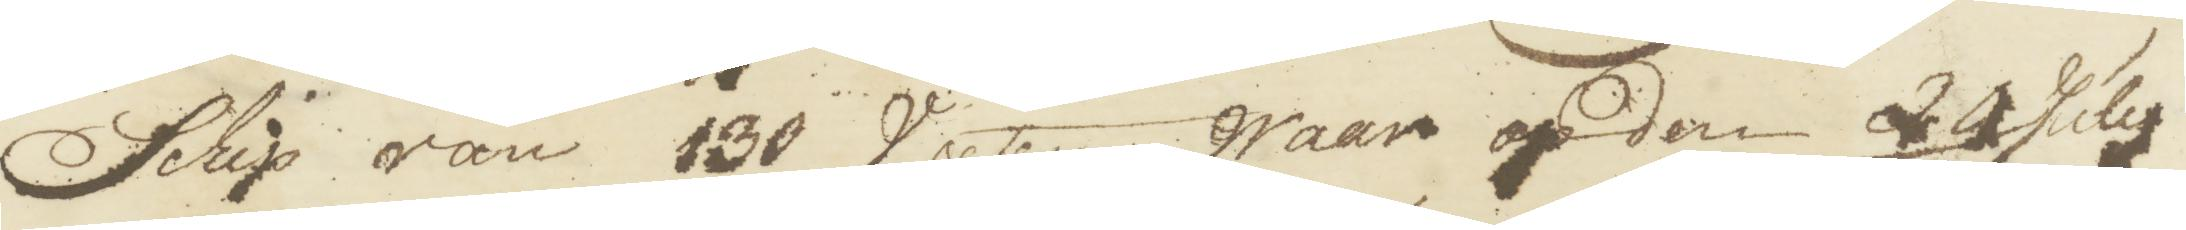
schip van 130 vaten waar op den 24 July
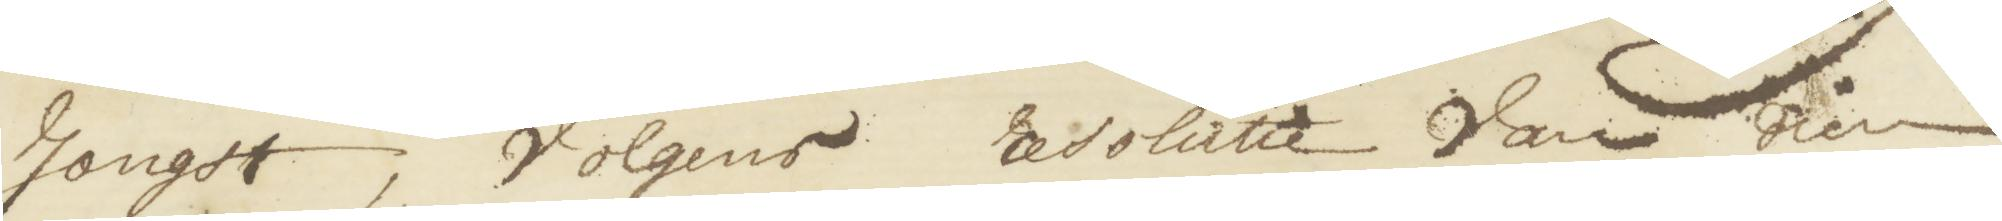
Jongst, volgens resolutie van den
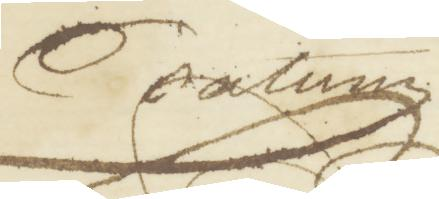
Conting
